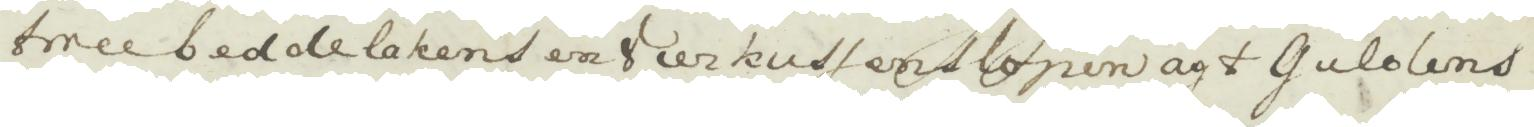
twee beddelakens en Vier kussenslopen agt Guldens
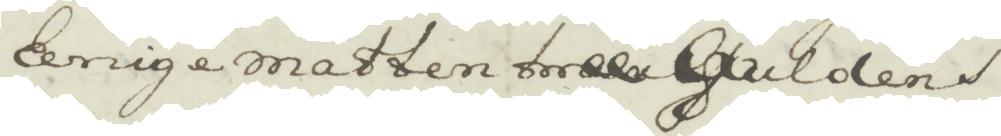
Eenige matten tweer Guldens
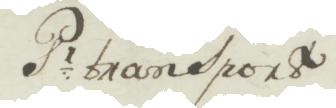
P:r transport
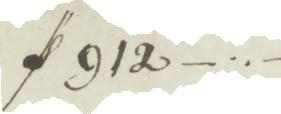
ƒ 912 —.. —
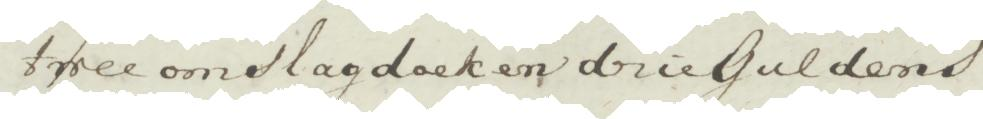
twee omslagdoeken drie Guldens
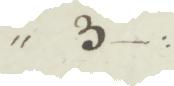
„ 3 —.
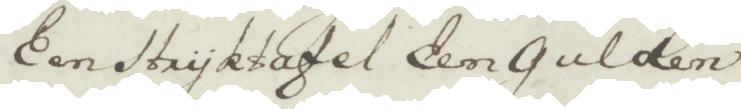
Een strijktafel Een Gulden
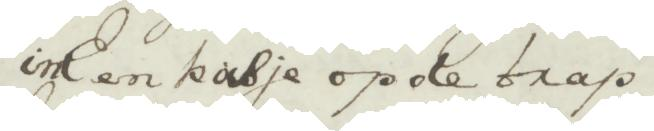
in Een kasje op de trap
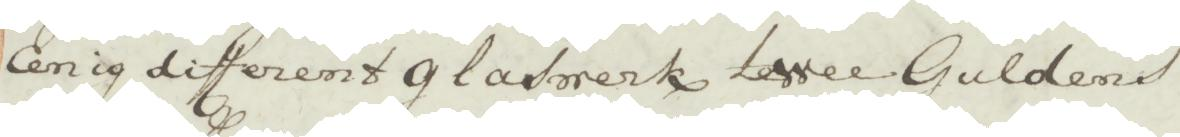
Eenig different glaswerk twee Guldens
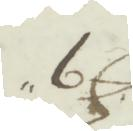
„ 6 —
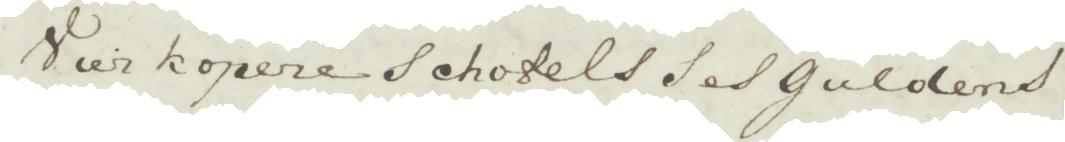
Vier kopere Schotels ses Guldens
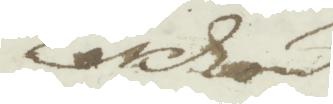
hakhout
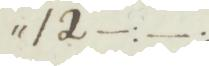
„ 12 —: —
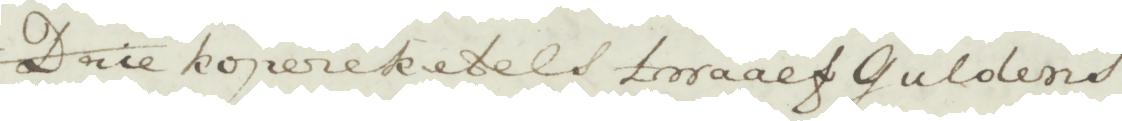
Drie kopere ketels twaalf Guldens
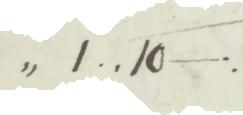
„ 1 ..10 —.
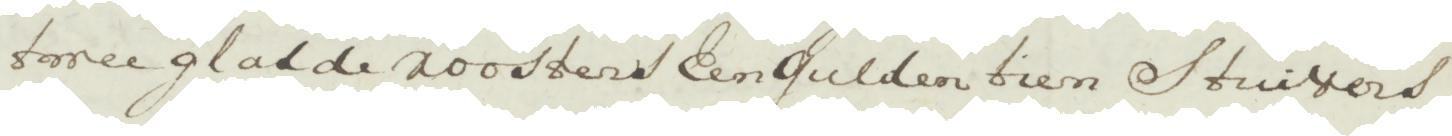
twee gladde roosters Een Gulden tien Stuivers
